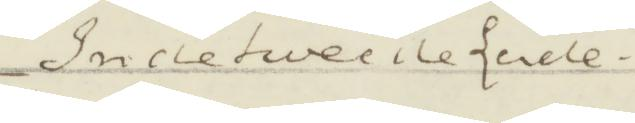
In de tweede Lade
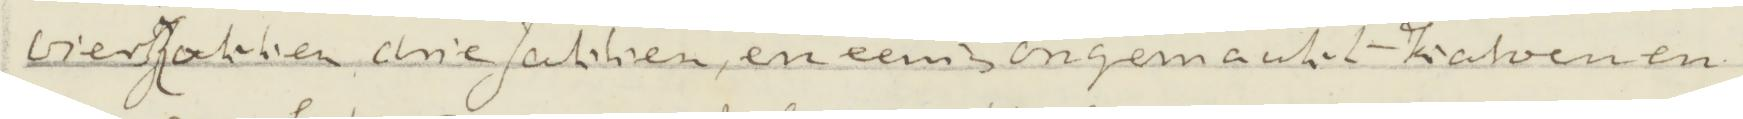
vier Rokken drie Jakken, en eenig ongemaakt katoen en
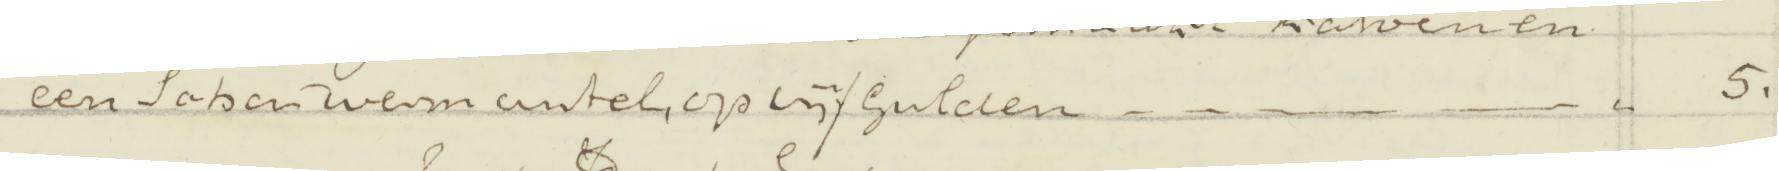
een schouwemantel, op vijf Gulden - - - - - - - „ 5„
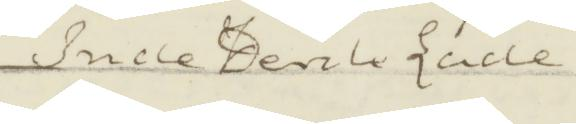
In de Derde Lade
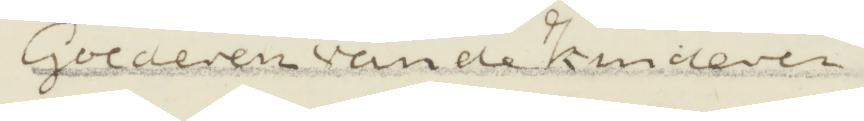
Goederen van de kinderen
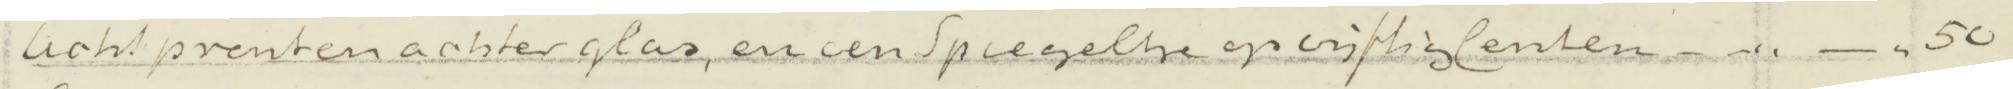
Acht prenten achter glas, en een Spiegeltje op vijftig Centen - - „ — „ 50
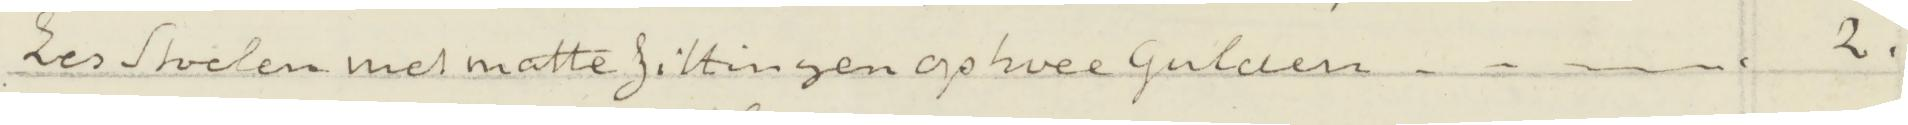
zes stoelen met matte zittingen op twee gulden - - - - - „ 2
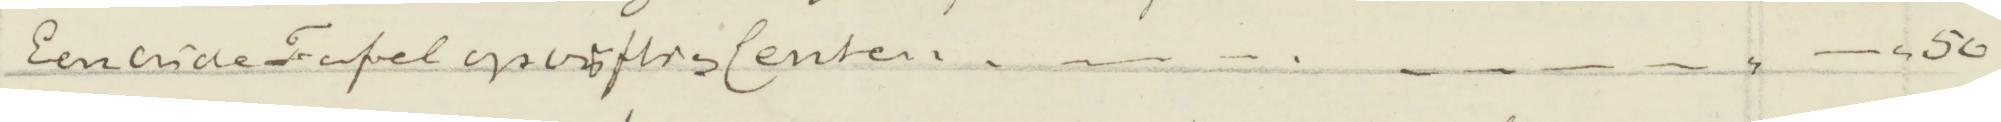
Een oude Tafel op vijftig Centen - - - - - - - - - „ — „ 50
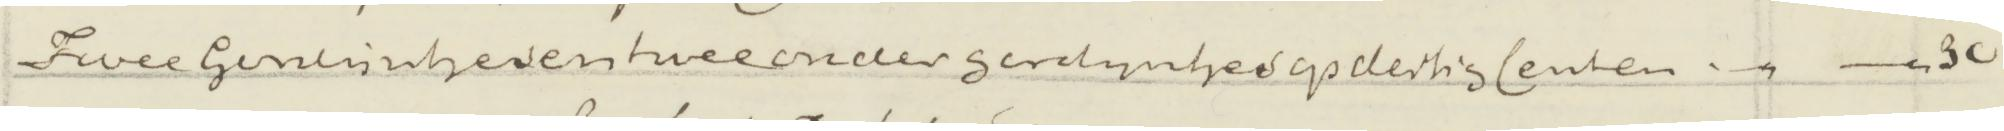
Twee Gordijntjes en twee onder gordijntjes op dertig Centen - „ —„30
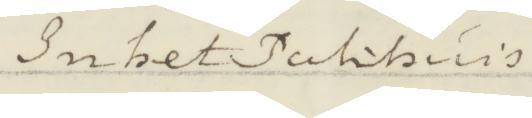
In het Pakhuis
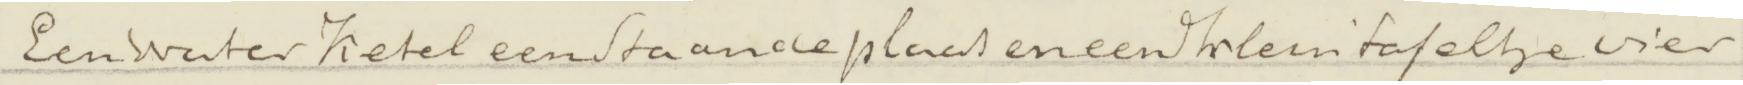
Een water ketel een staande plaat en een kleintafeltje vier
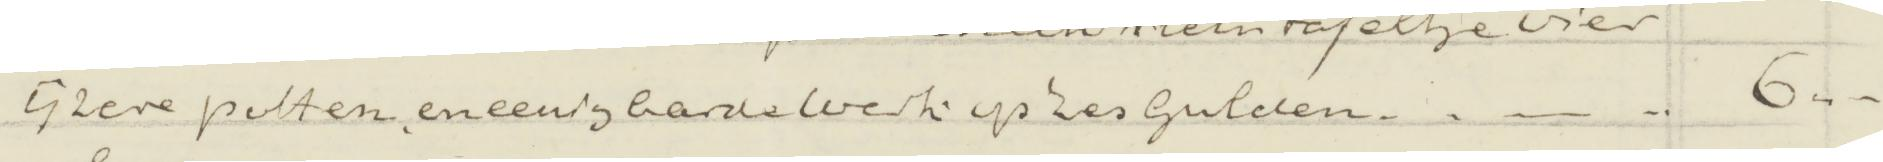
ijzere potten en eenig aardewerk op zes Gulden - - - „ 6„ —
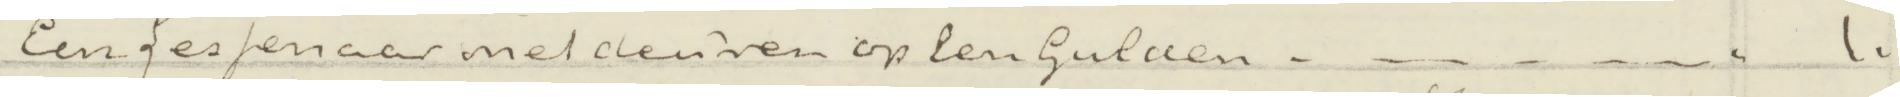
Een Lessenaar met deuren op Een Gulden - - - - - - - „ 1
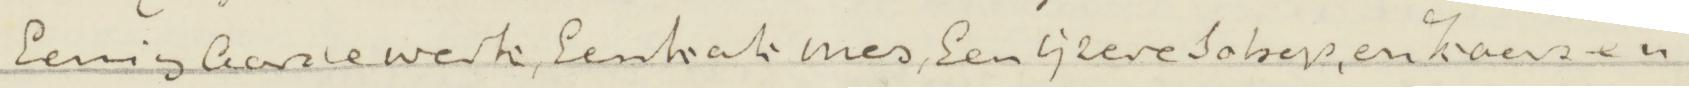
Eenig aardewerk, Een hakmes, Een ijzere schop, en kaarsen
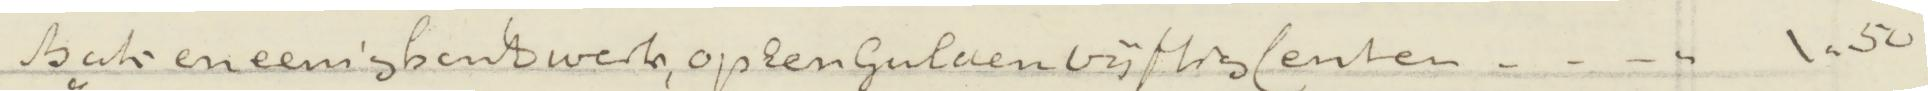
Bak en eenig hout werk, op Een Gulden vijftig Centen - - - „ 1„ 50
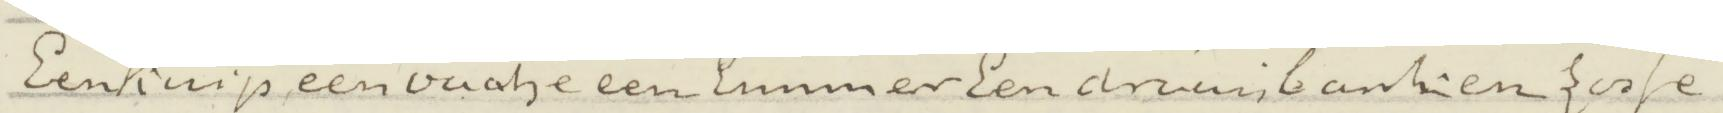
Een kuip, een vaatje een Emmer Een draaijbank en Losse
